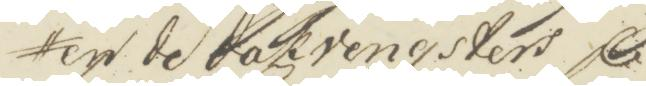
#en de dat vengsters
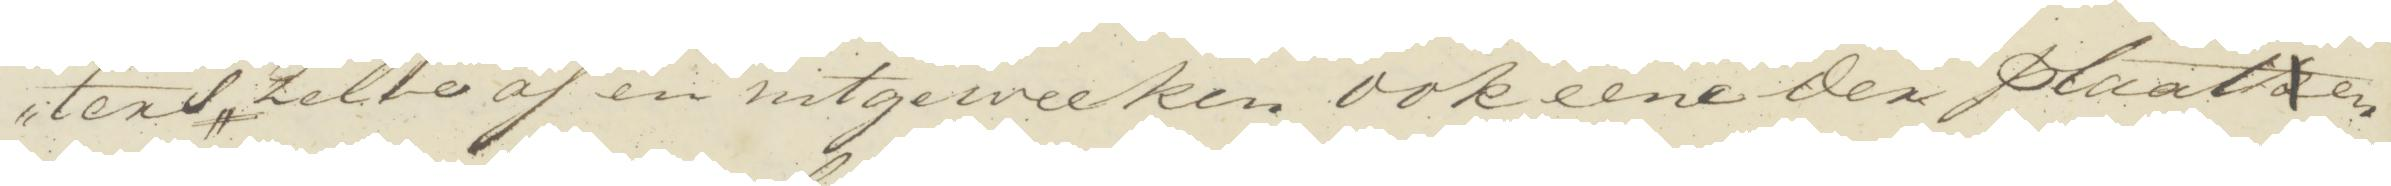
„ters # Zelve af en uitgeweeken ook eene der plaatszen
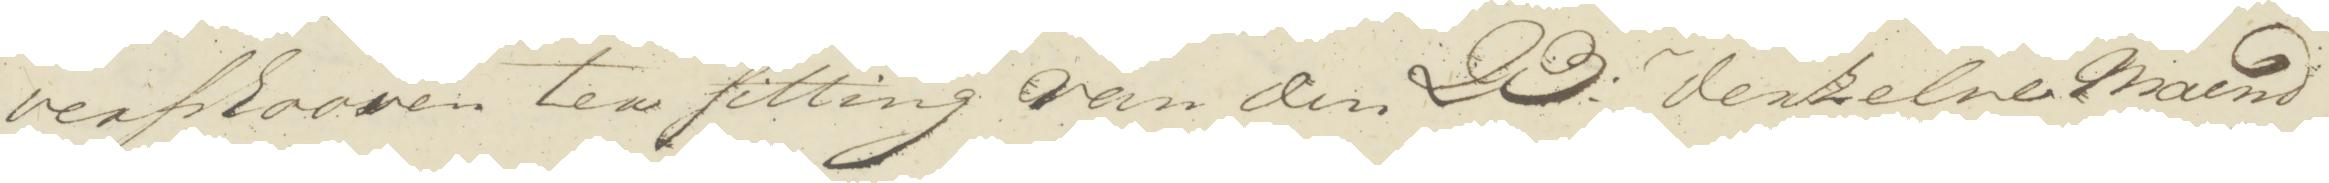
verschooven ter sitting van den 23: derzelve maend
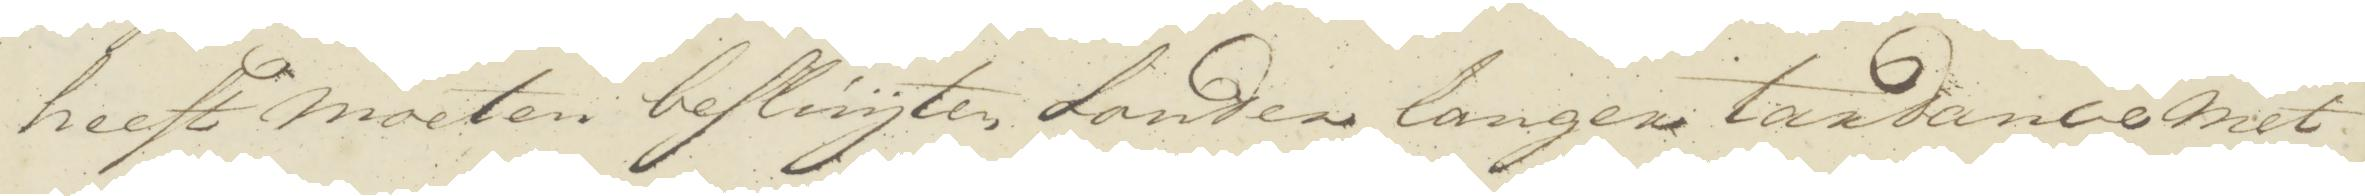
heeft moeten besluijten Sonder langer tardance met
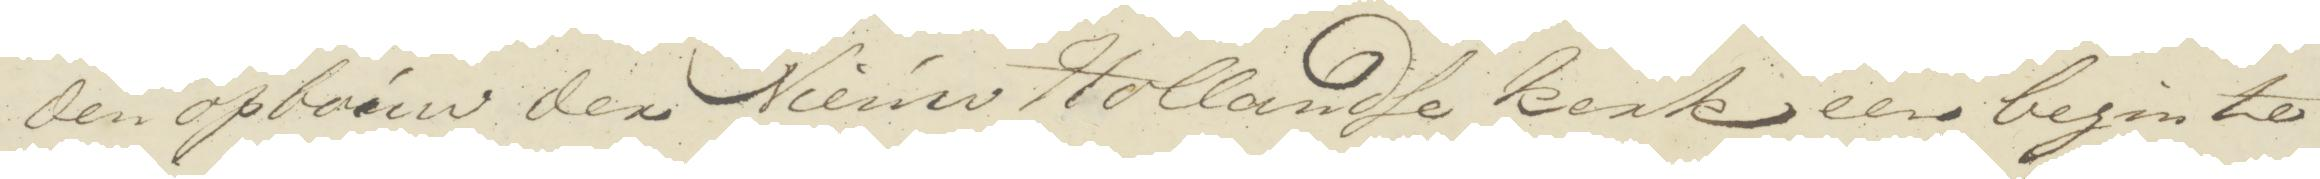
den opbouw der Nieuw Hollandse kerk een begin te
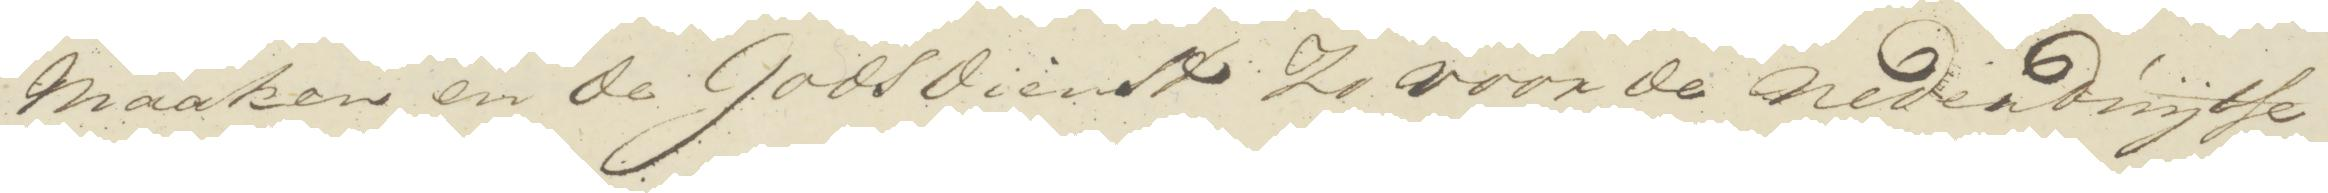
maaken en de Godsdienst Zo voor de nederduijtse
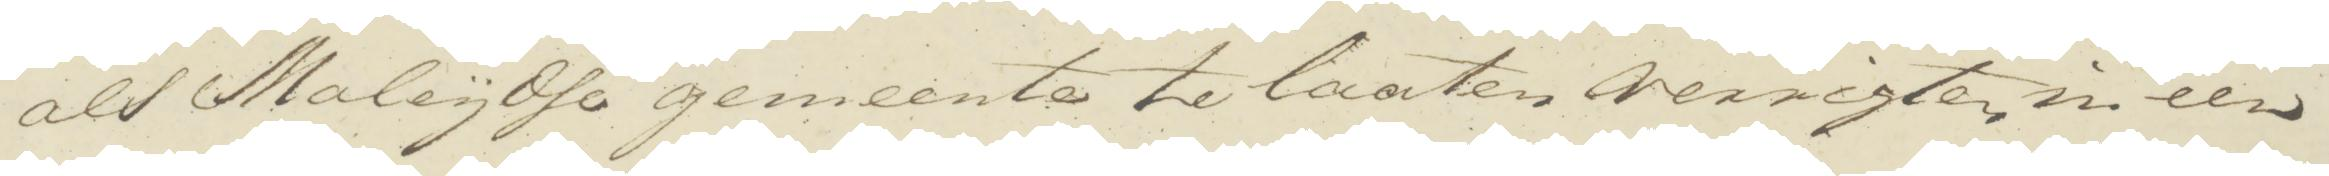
als Maleijdse gemeente te laaten verrigten in een
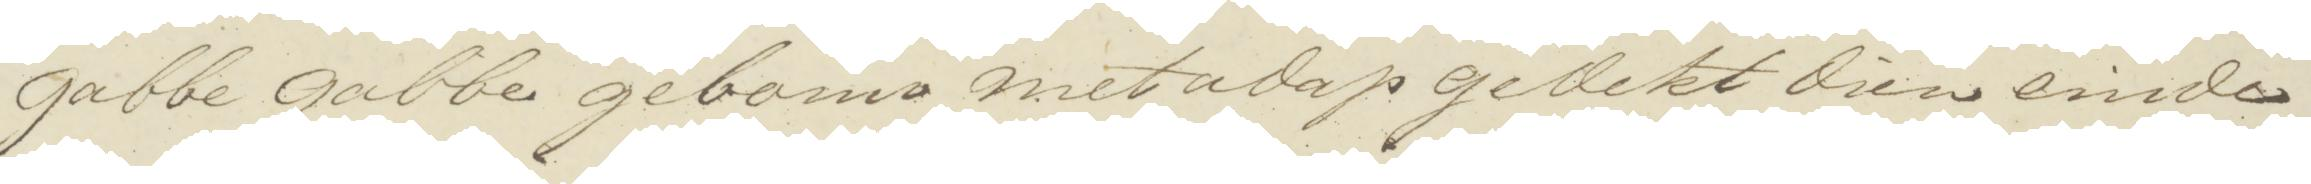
gabbe gabbe gebouw met adap gedekt dien einde
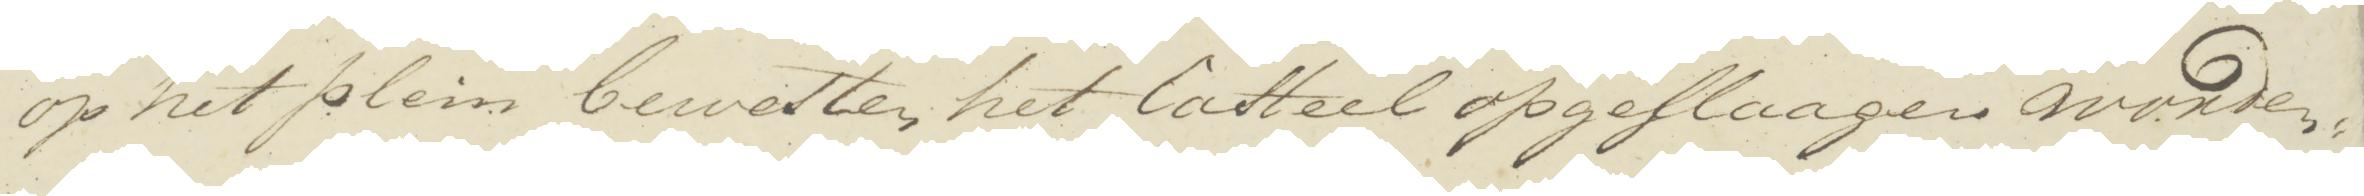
op het plein bewesten het Casteel opgeslaagen worden„
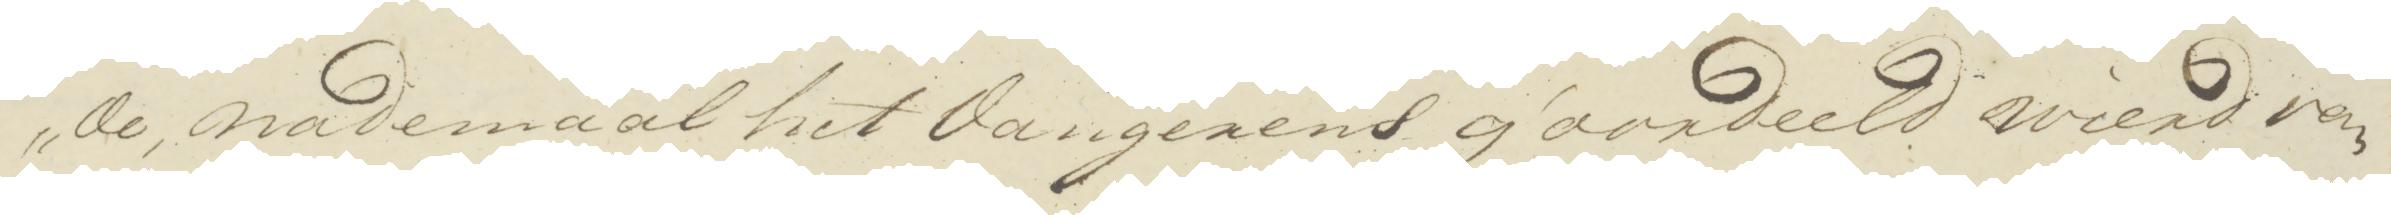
„de, nademaal het dangereus g’oordeeld wierd van
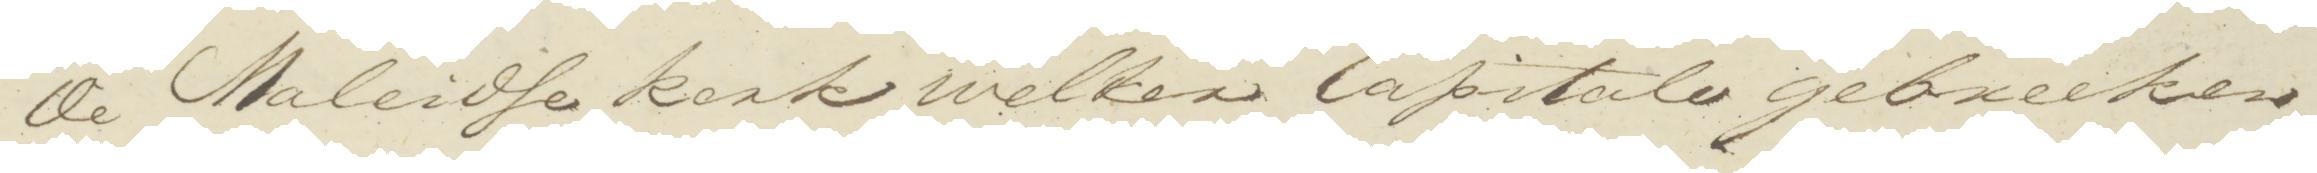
de Maleidse kerk welker capitale gebreeken,
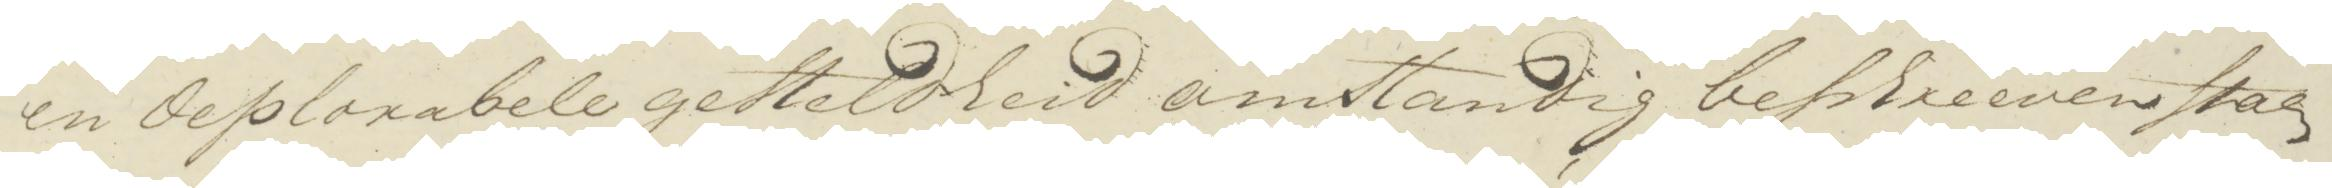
en deplorabele gesteldheid omstandig beschreeven staen
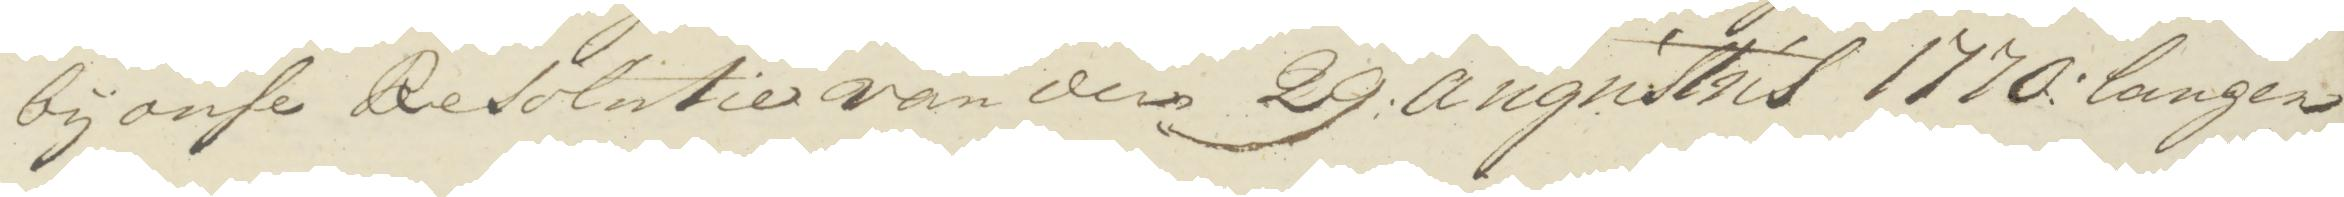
bij onse Resolutie van den 29: augustus 1770: langen
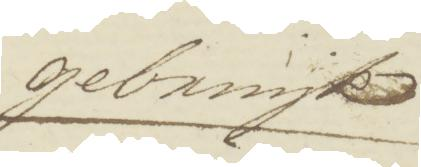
gebruijk
